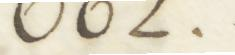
662.
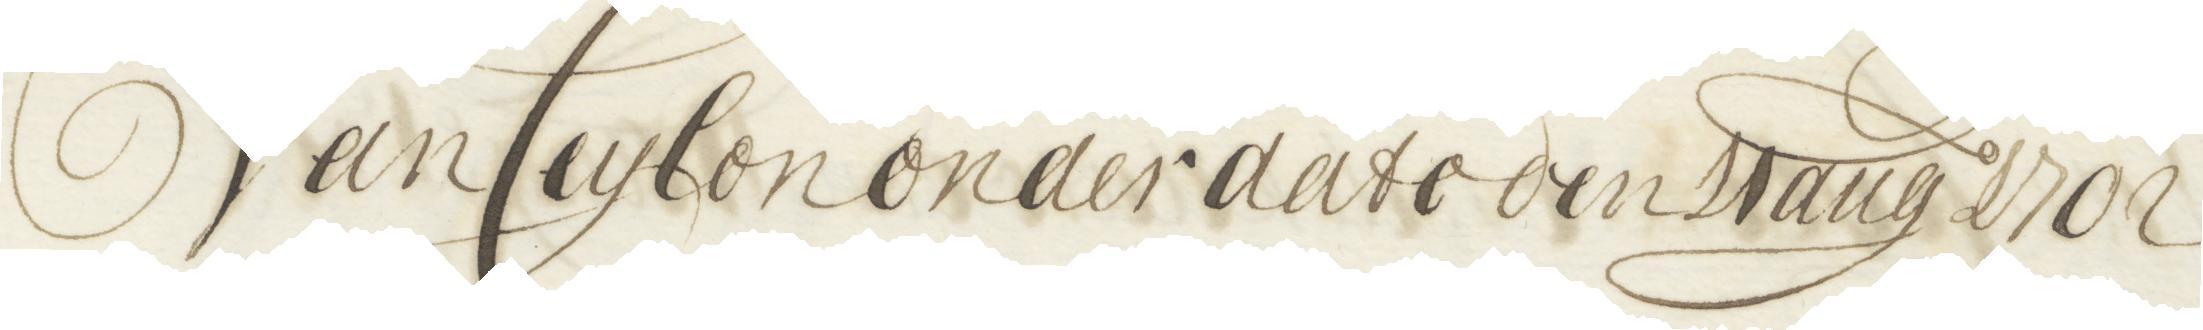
Van Ceijlon onder dato den 11 aug 1702
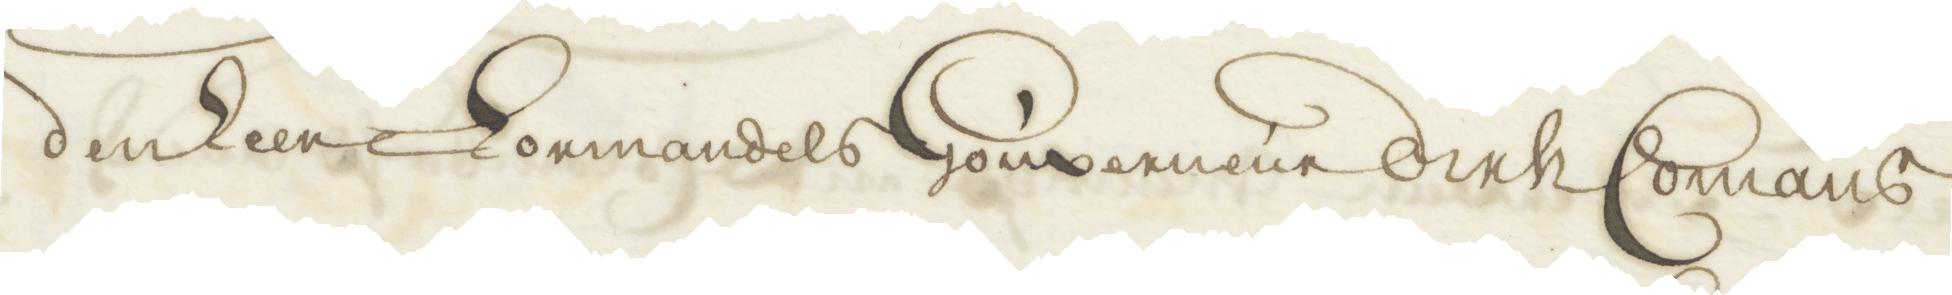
den heer Cormandels Gouverneur dirk Comans
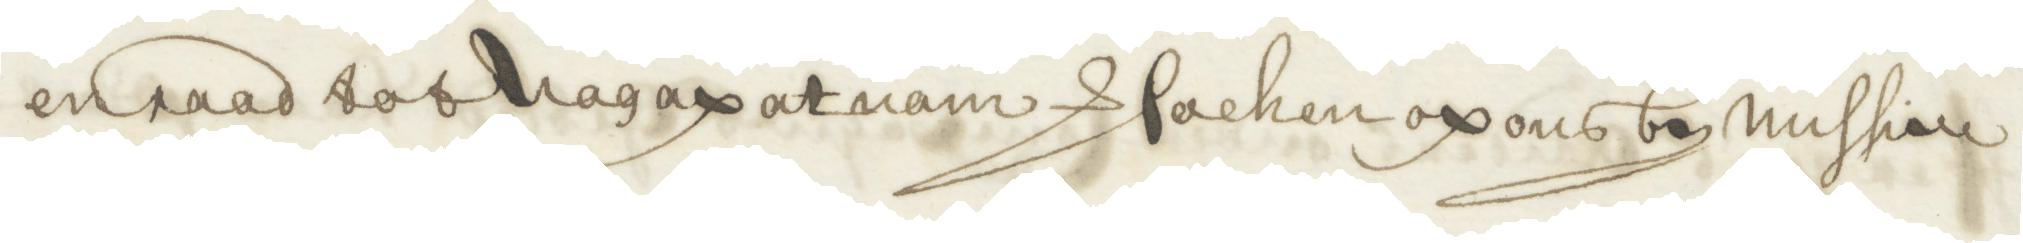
en raad tot nagapatnam versoeken op ons bij missive
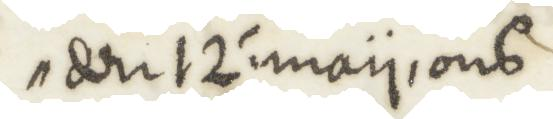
„den 12: maij, ons
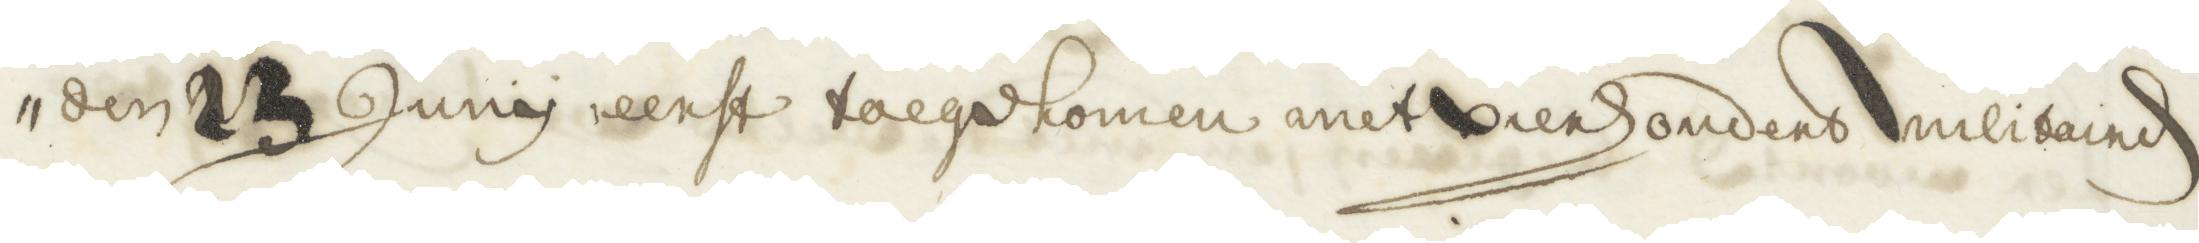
„den 23 Junij, eerst toegekomen met vierhondert militairen
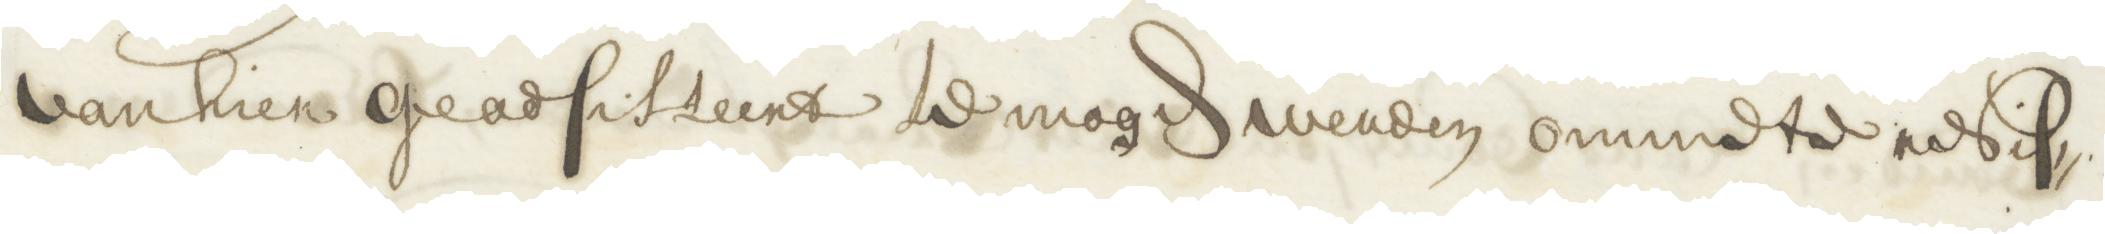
vanhier geadsisteert te mogen werden ommete resis„
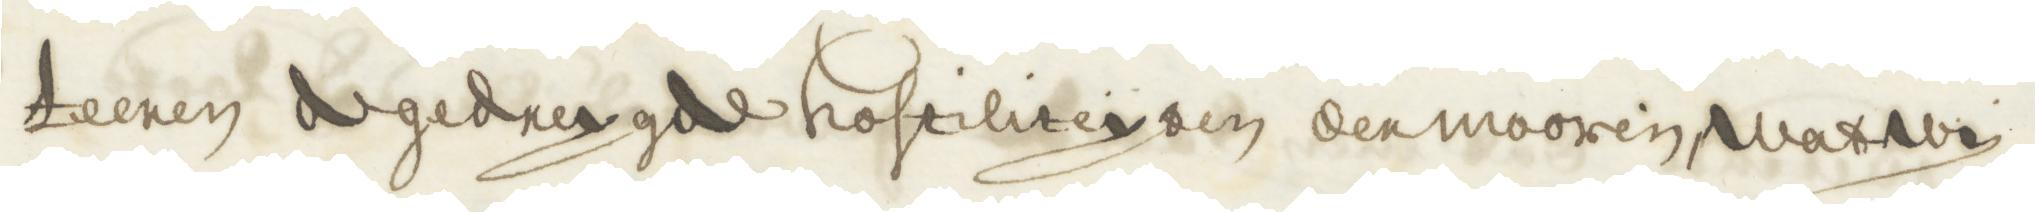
teeren de gedreijgde hostiliteijten der mooren, wat wij
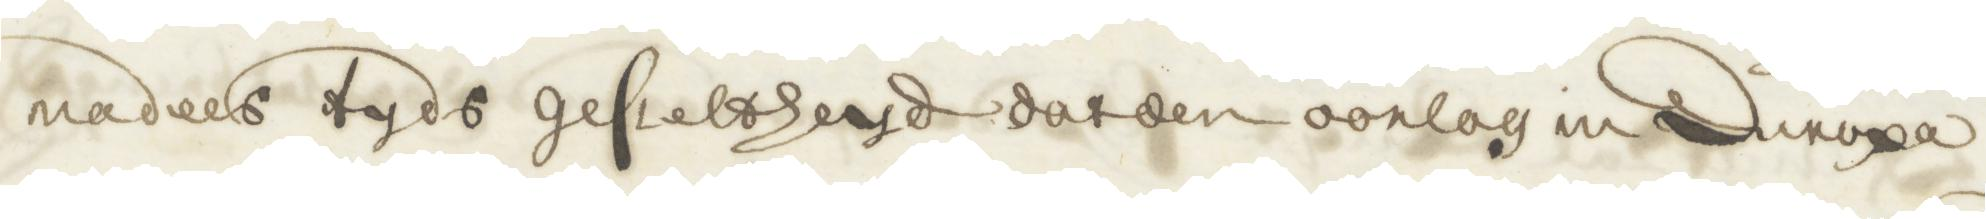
nadees tijds gesteltheyd datden oorlog in Europa
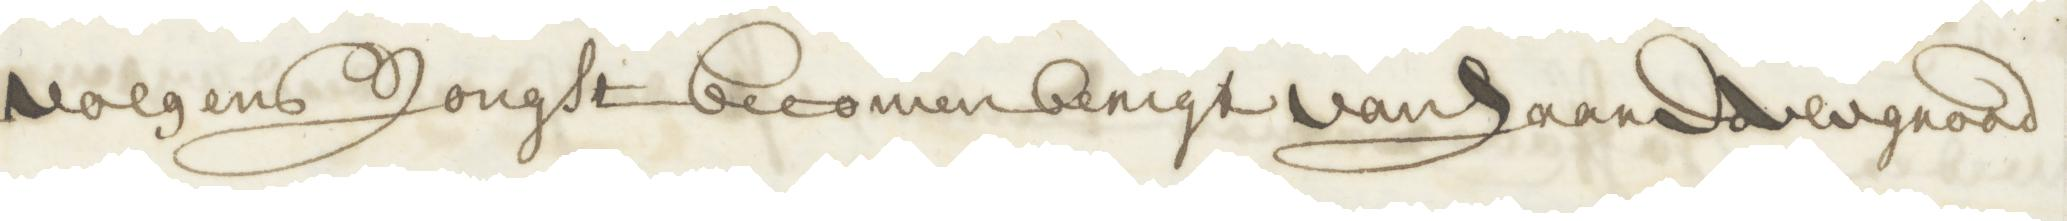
volgensJongst becomenberigt vanhaarEdelegrood
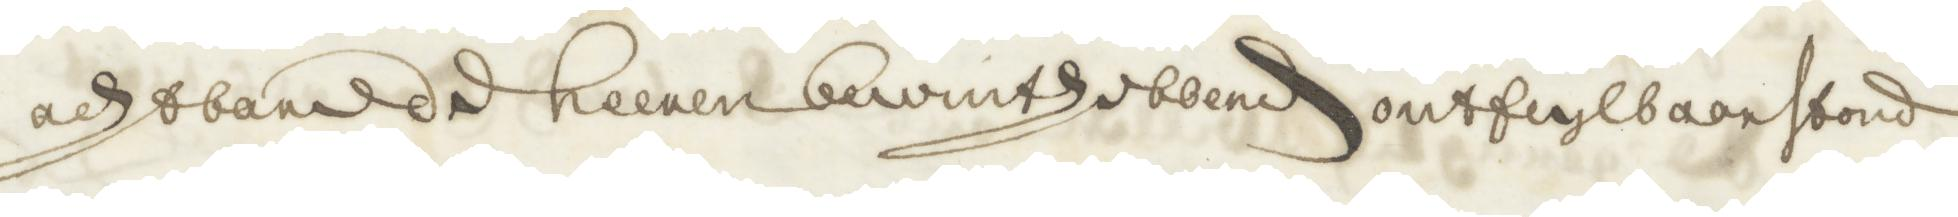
achtbare de heeren bewinthebberen ontfeijlbaerstond
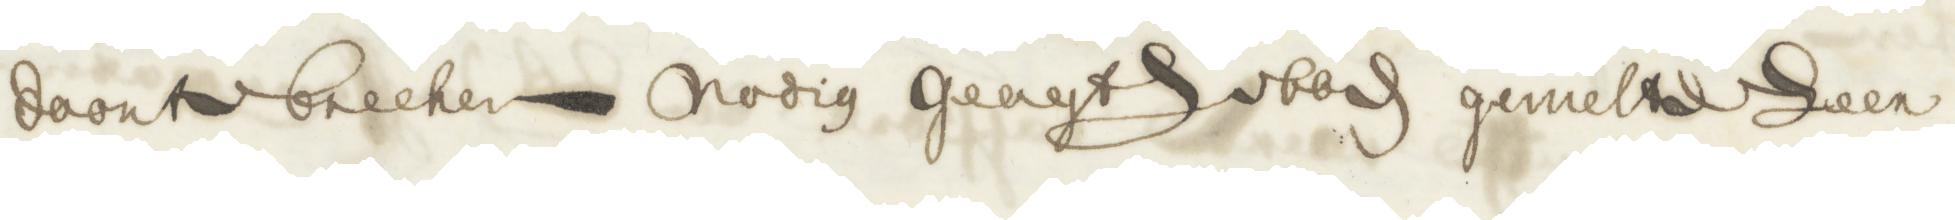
doortebreeken nodig geagthebben gemelteheer
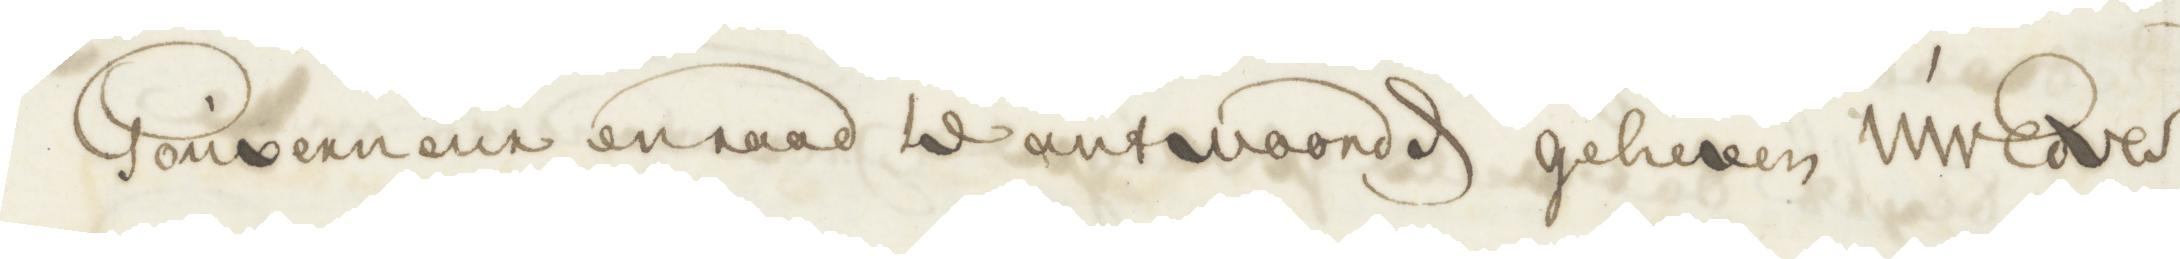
Gouverneur enraad te antwoorden gelieven UwEdele
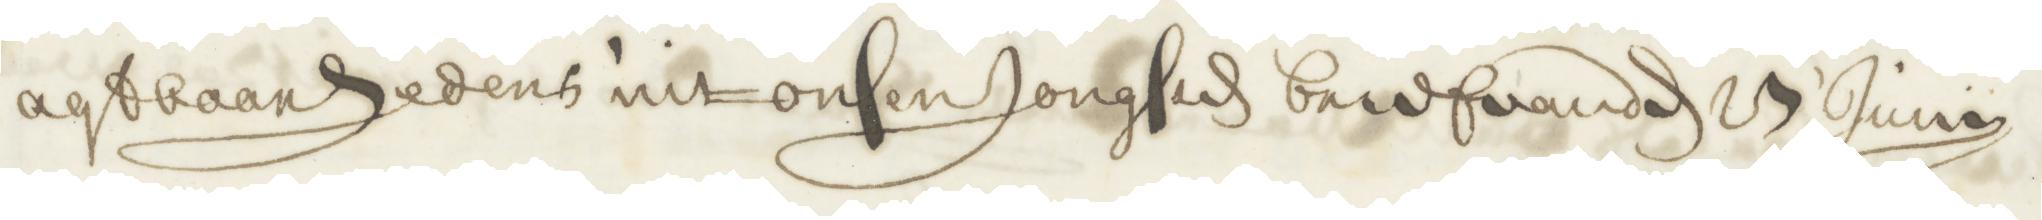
agtbaarhedens uit onsenjongsten briefvanden 27' Junij
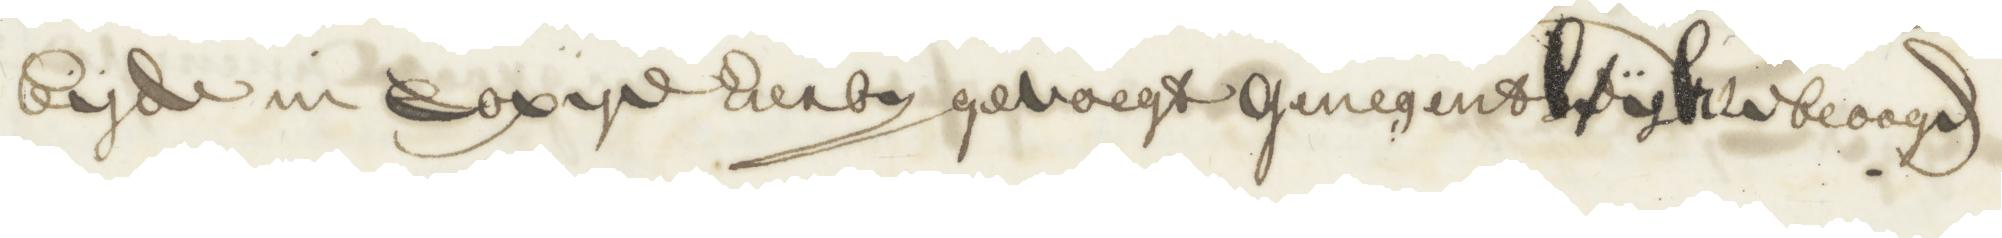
bijde in copije hierbij gevoegt genegentleijk tebeoogen
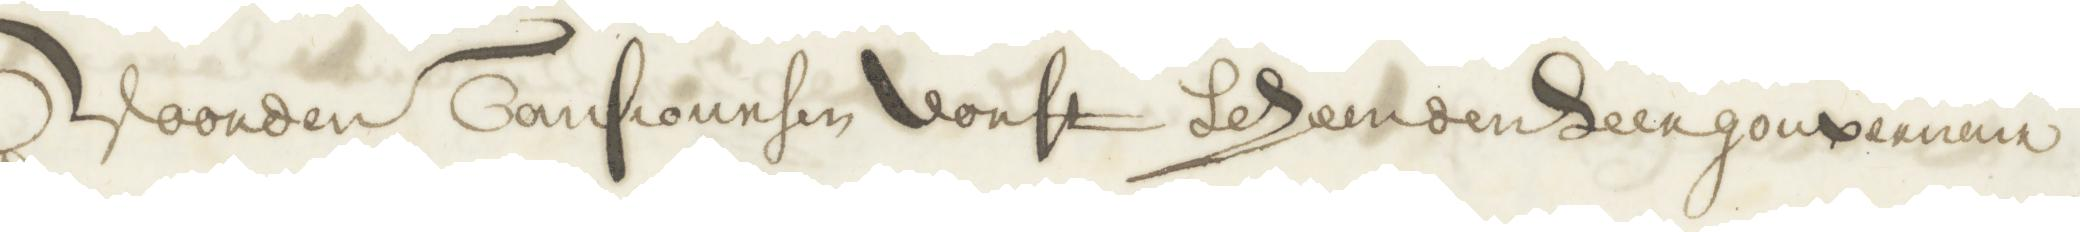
Voorden Cansioursen vorst scheendenheergouverneur
